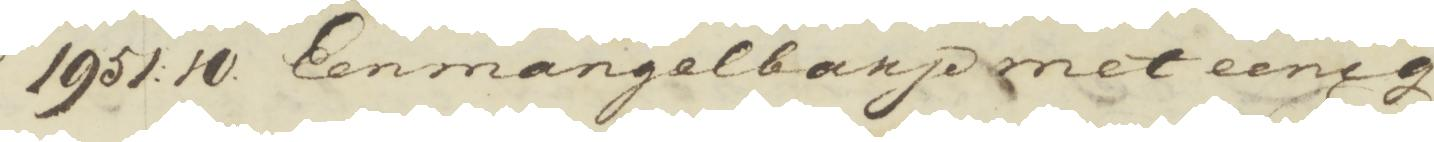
1951:10. Een mangelbakje met eenig
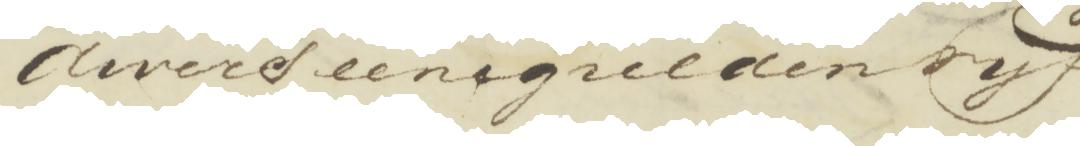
divers eene gulden vyf
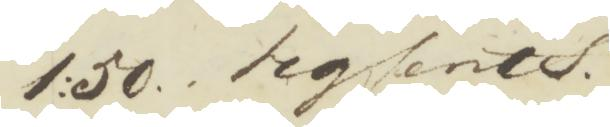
1:50. tig Cents.
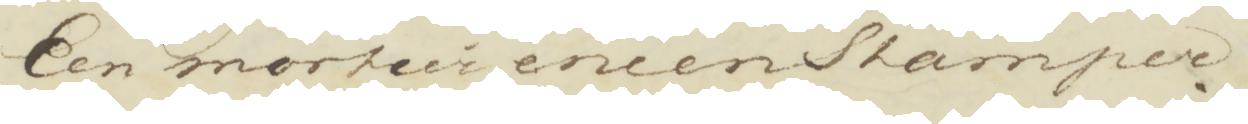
Een mortier en een stamper
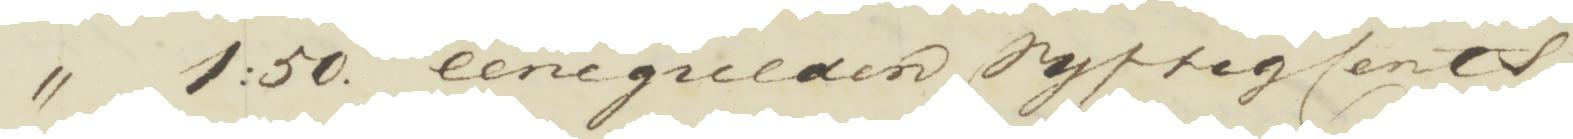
„ 1:50. eene gulden vyftig Cents
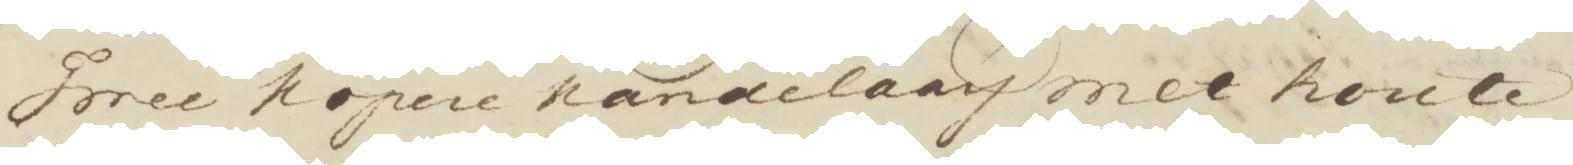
Twee kopere kandelaars met houte
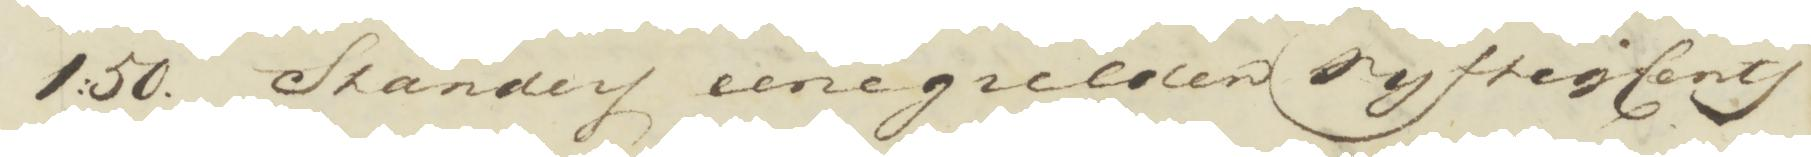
1:50. Standers eene gulden vyftig Cents
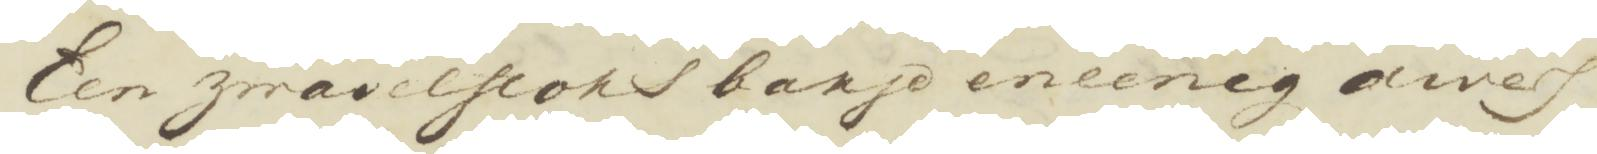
Een zwavelstoks bakje en eenig divers
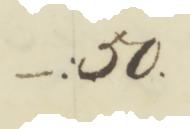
—:50.
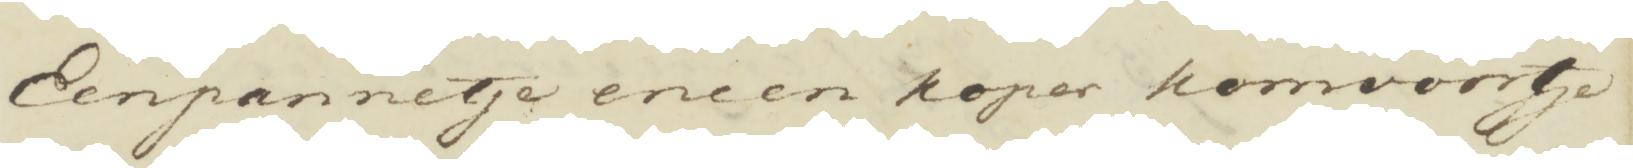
Een pannetje en een koper komvoortje
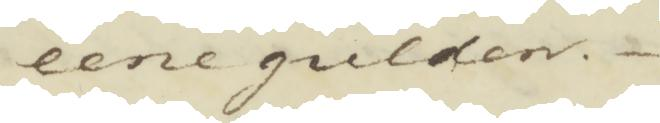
eene gulden.-
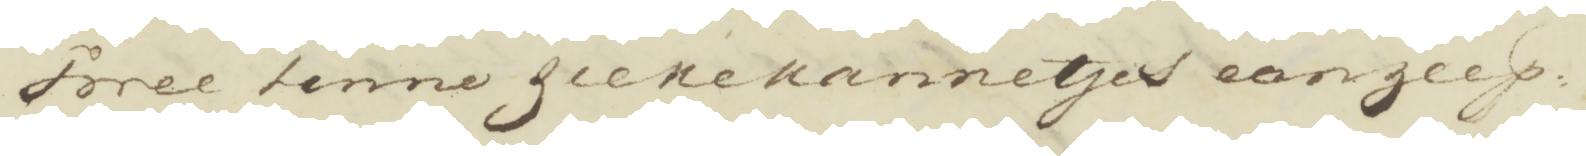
Twee tinne ziekekannetjes een zeep:
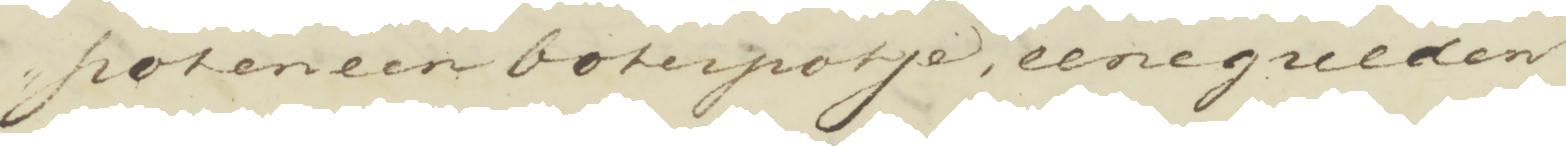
„pot en een boterpotje, eene gulden
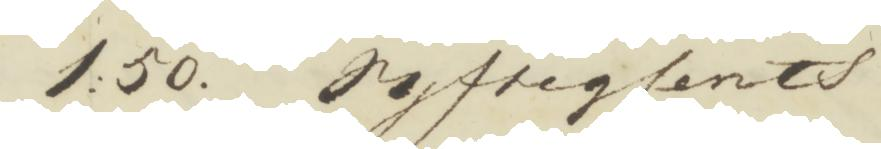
1:50. Vyftig Cents
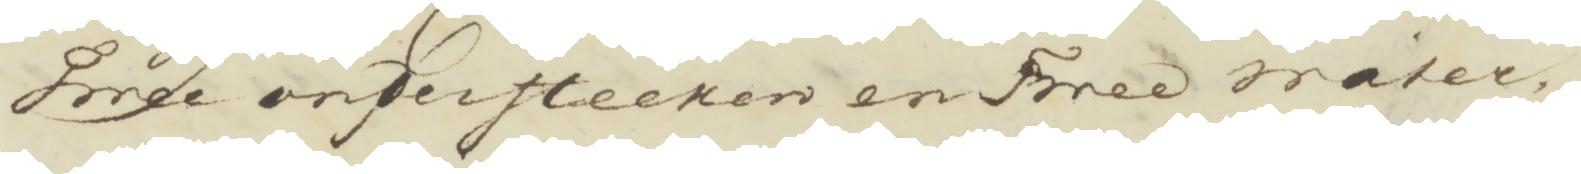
Twee ondersteeken en Twee water,
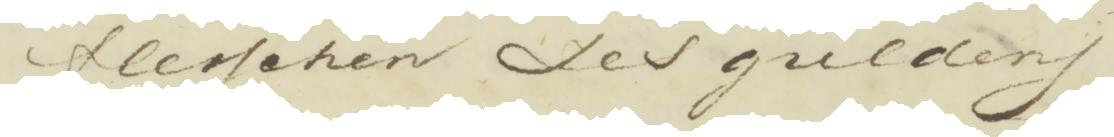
flesschen zes guldens
